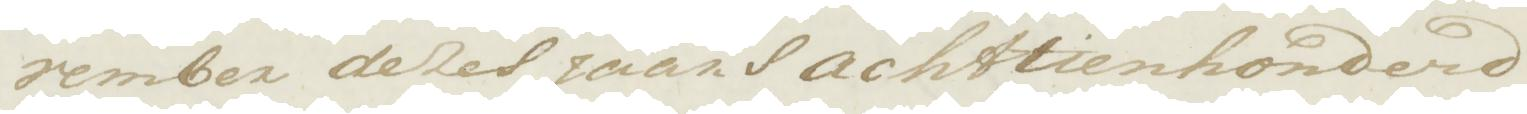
=vember dezes jaars achttienhonderd
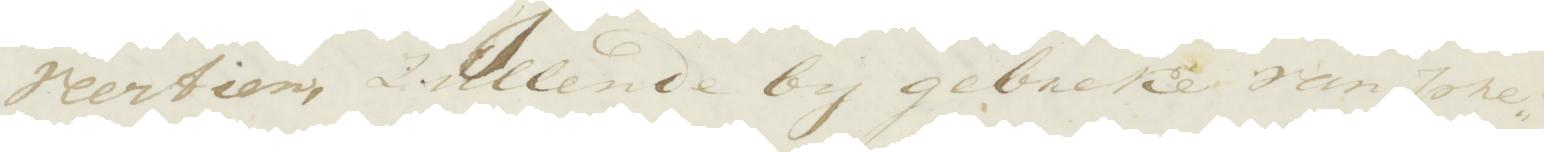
veertien, zullende bij gebreke van pre„
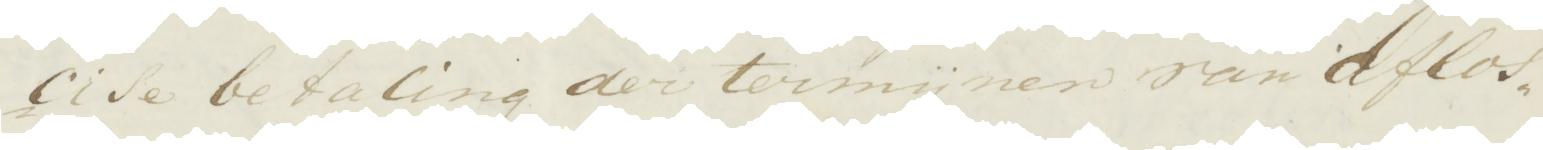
=cise betaling der termijnen van aflos„
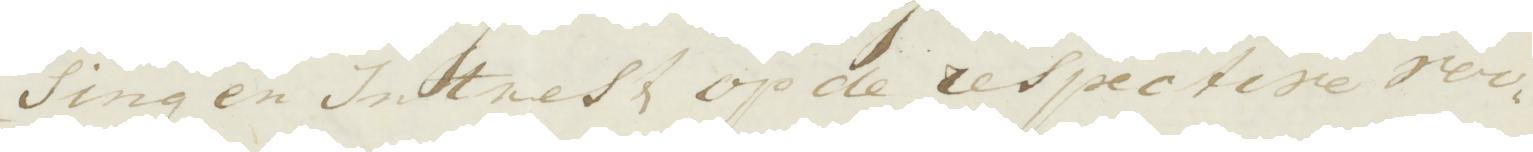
=sing en Intrest op de respective ver„
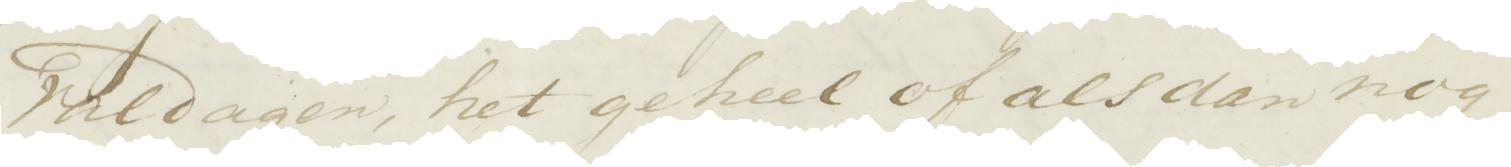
=valdagen, het geheel of als dan nog
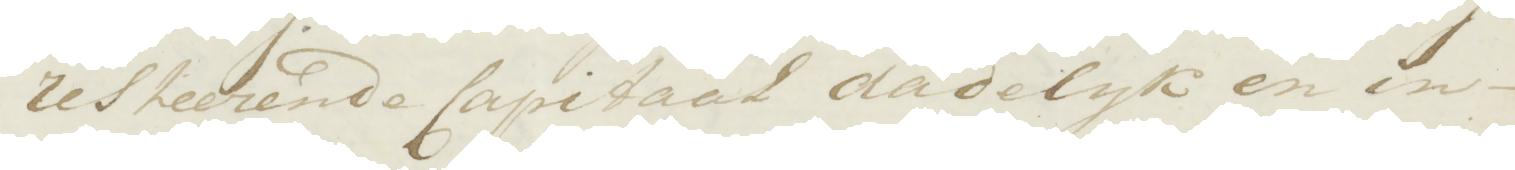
resteerende Capitaal dadelyk en in-
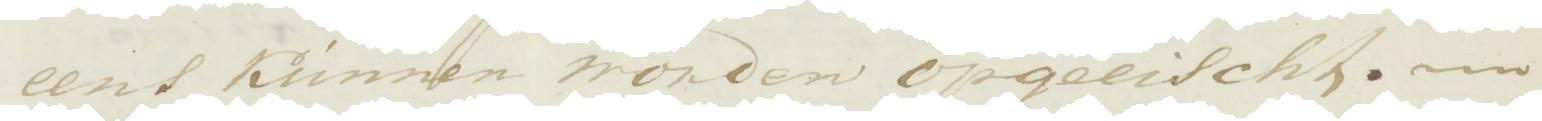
eens kunnen worden opgeeischt.
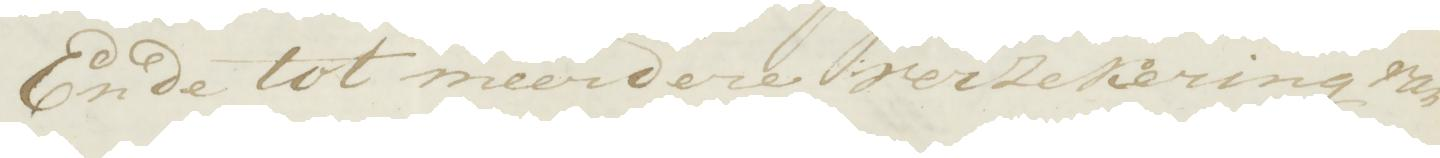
En de tot meerdere verzekering van
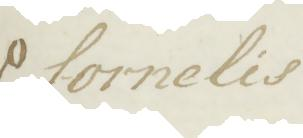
¶ Cornelis
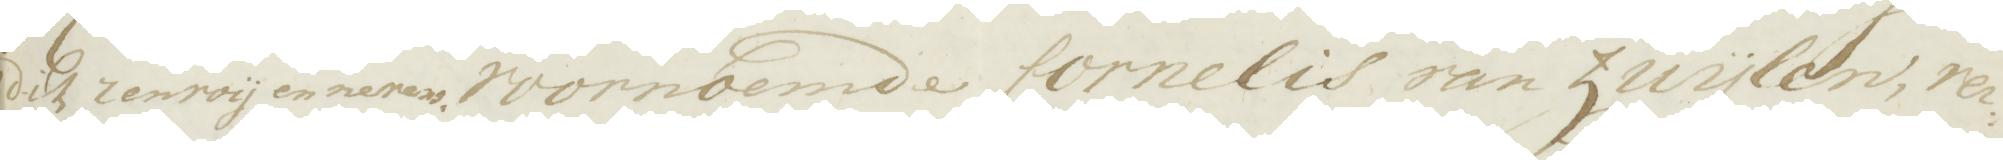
dit renvoij en neven, voornoemde Cornelis van Zuijlen, ver:
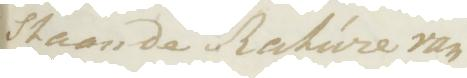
staande Rature van
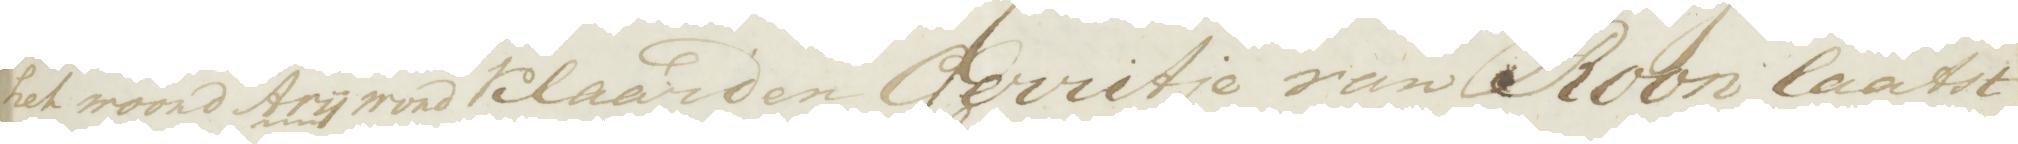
het woord Arij word klaarden Gerritje van Roon laatst
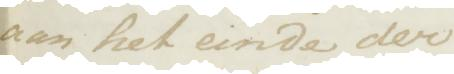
aan het einde der
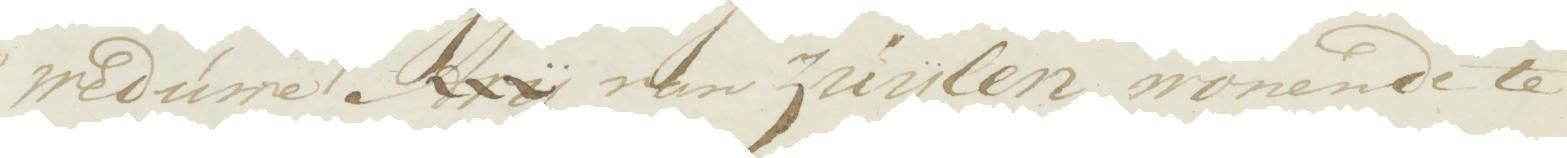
weduwe Arij van Zuijlen, wonende te
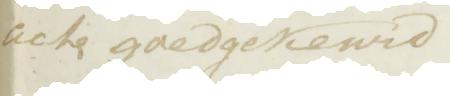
acte goedgekeurd
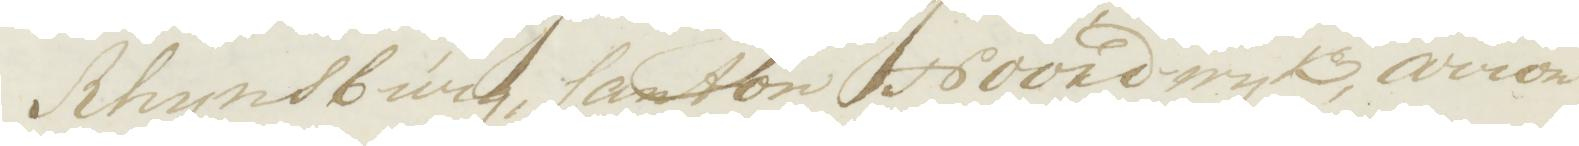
Rhynsburg, Canton Noordwyk, arron
